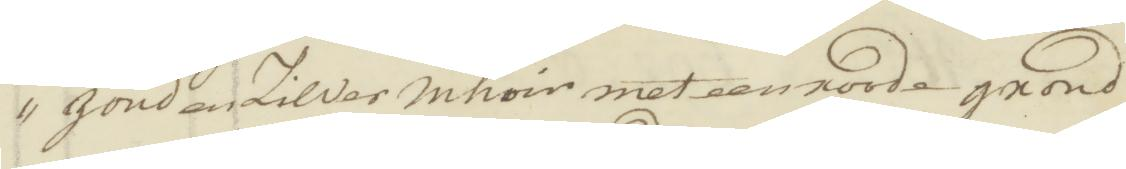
„ goud en zilver mhoir met een roode grond
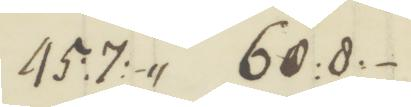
45:7:-„ 68:8.—
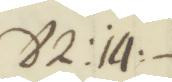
82:14:
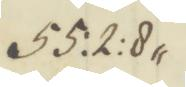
55:2:8„
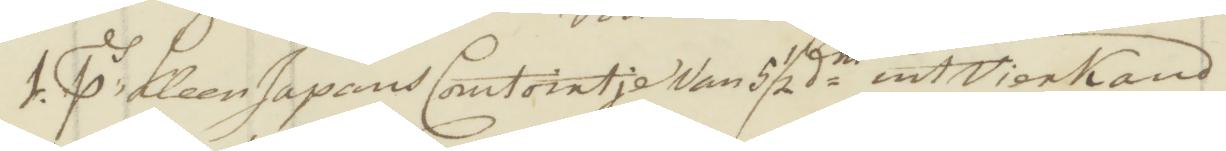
1. p„s kleen Japans Comtoirtje van 5½ d=m in't vierkand
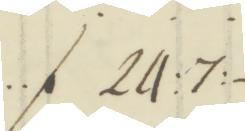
. ƒ 24:7:
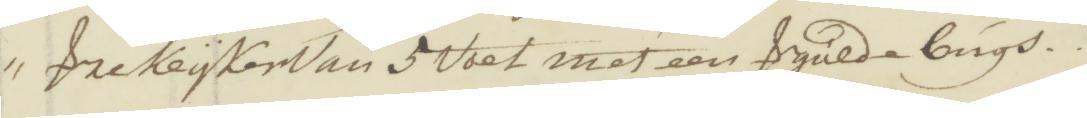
„ verrekeijker van 5 voet met een vergulde buys .
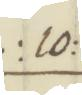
:10
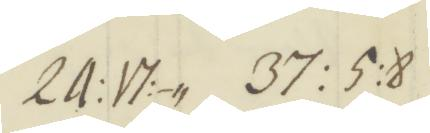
24:17:-„ 37:5:8
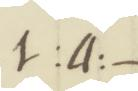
1:4:—
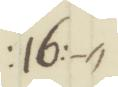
16:-
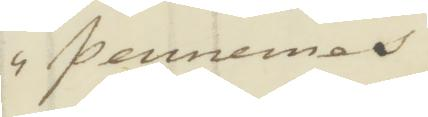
„ pennemes
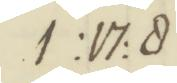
1:17:8
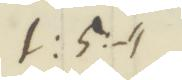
1:5:-
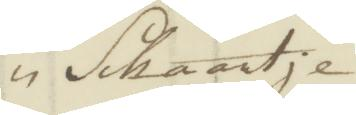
„ schaartje
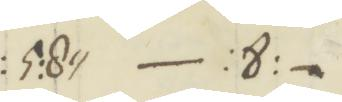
5:8„ — :8:—
